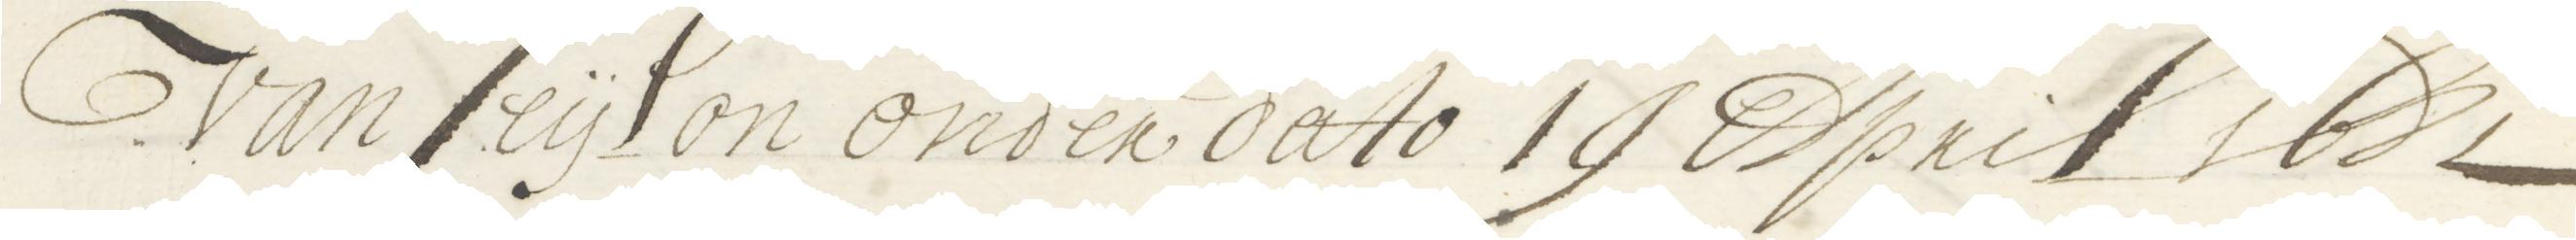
Van Ceijlon onder dato 19 April 1681
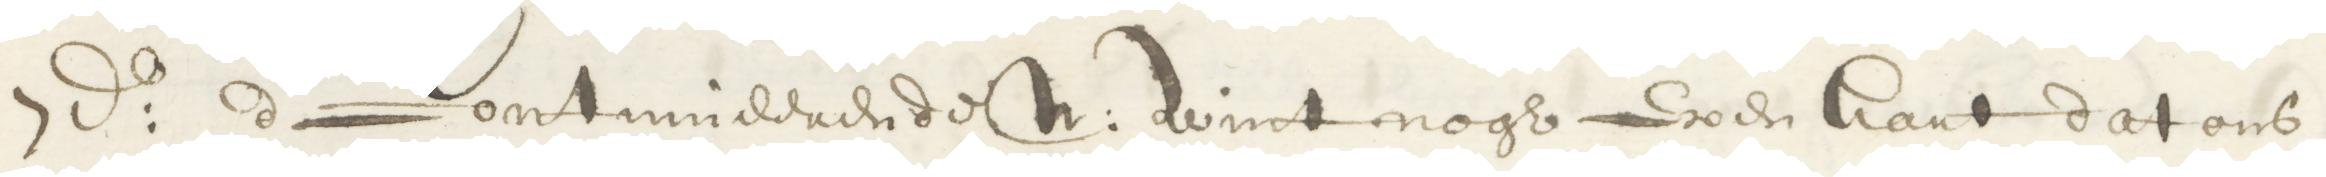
7 d:o d'_ Continueerende N: wint nogh Even hart dat ons
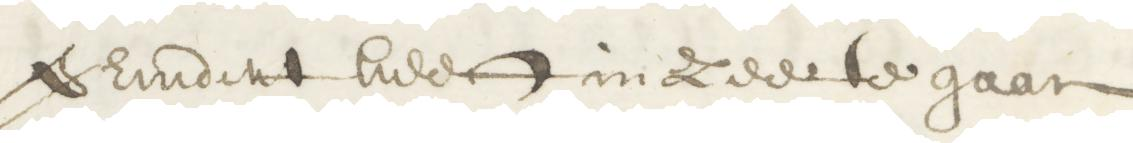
verhindert heeft in Zee te gaan
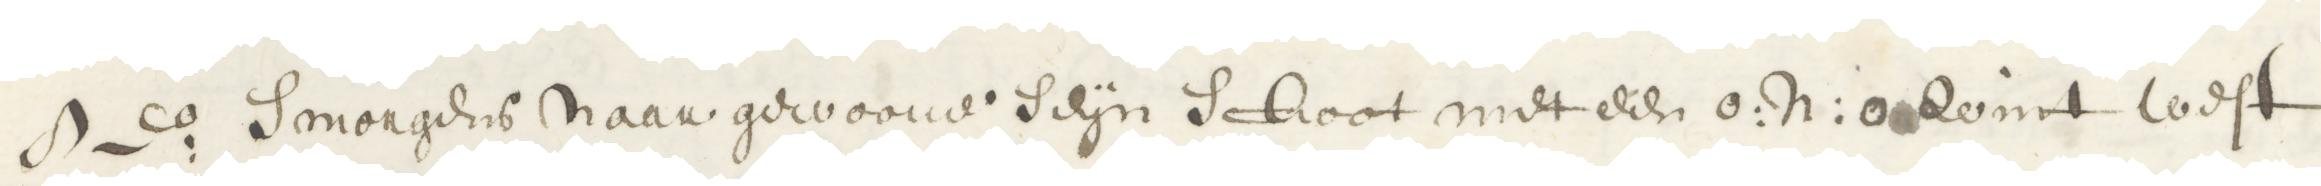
8 _:o Smorgens naar gewoone Seijn Schoot met een o:N:o wint west
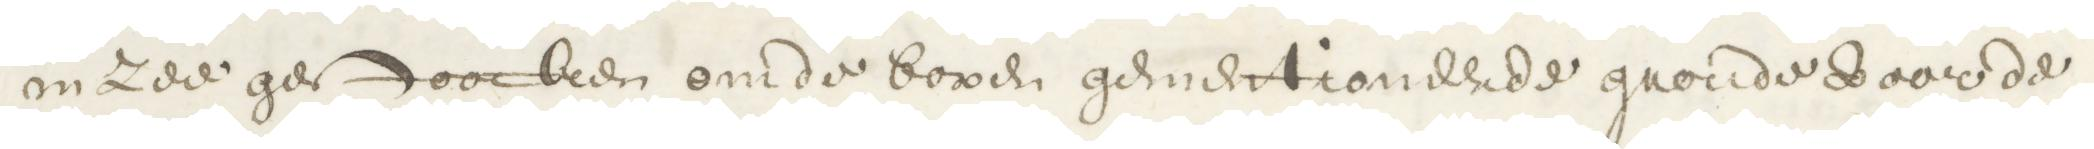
in Zee gestoocken om de boven gementioneerde gronde voor de
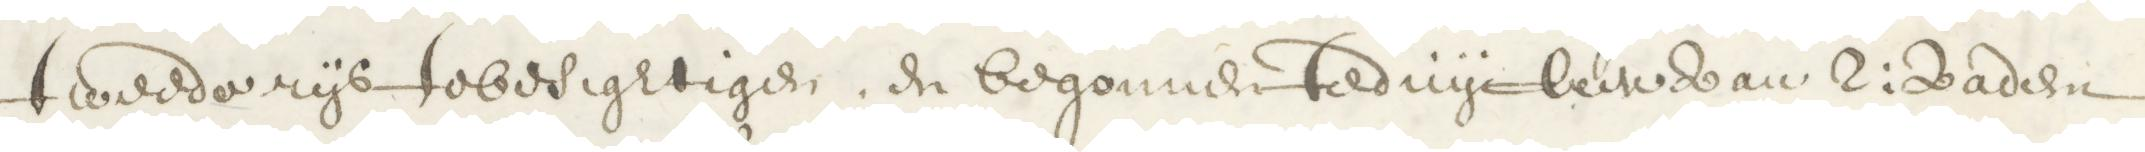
tweede rijs te besightigen, en begonnen te duijcken van 2: vaden
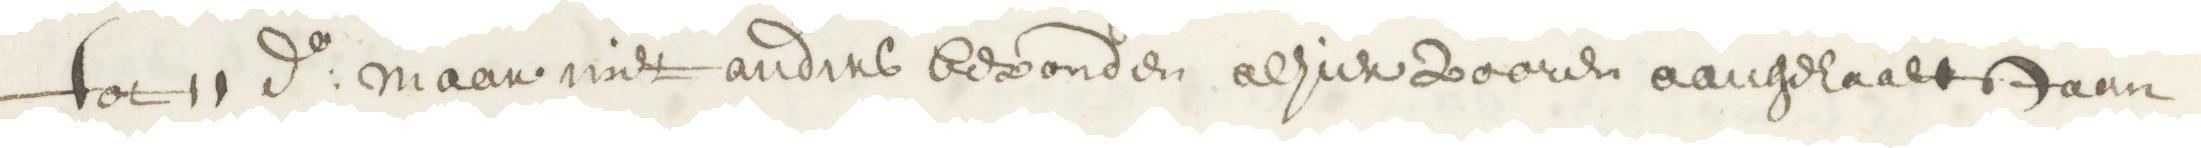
tot 11 d:o maar niet anders bevonden alhier vooren aangehaalt staan
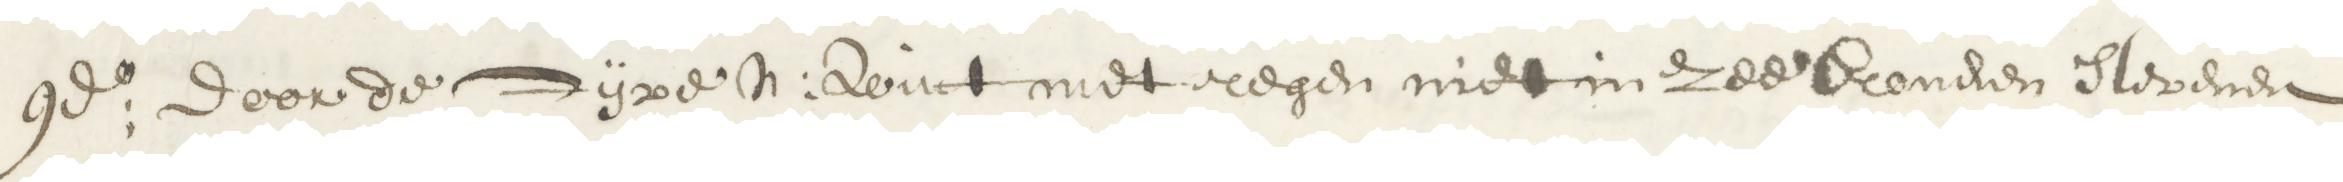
9 d:o Door de stijve N: Wint met regen niet in Zee konden Stevenen
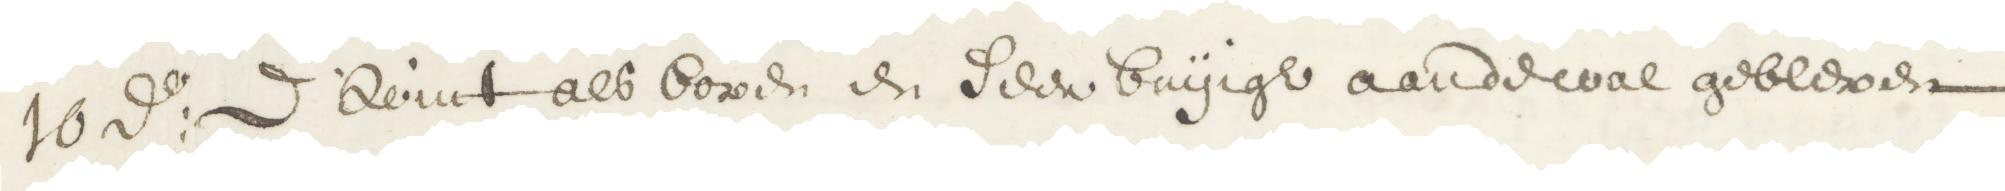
10 d:o d' Wint als boven en Seer buijigh aan de wal gebleven
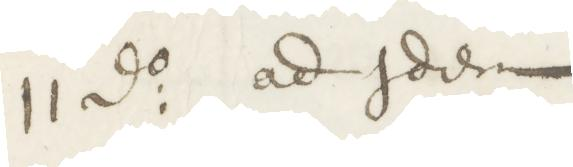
11 d:o ad jdem
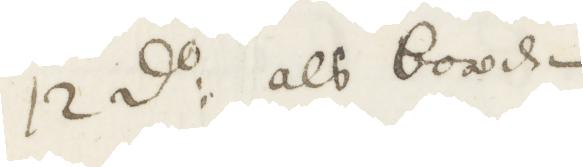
12 d:o als boven
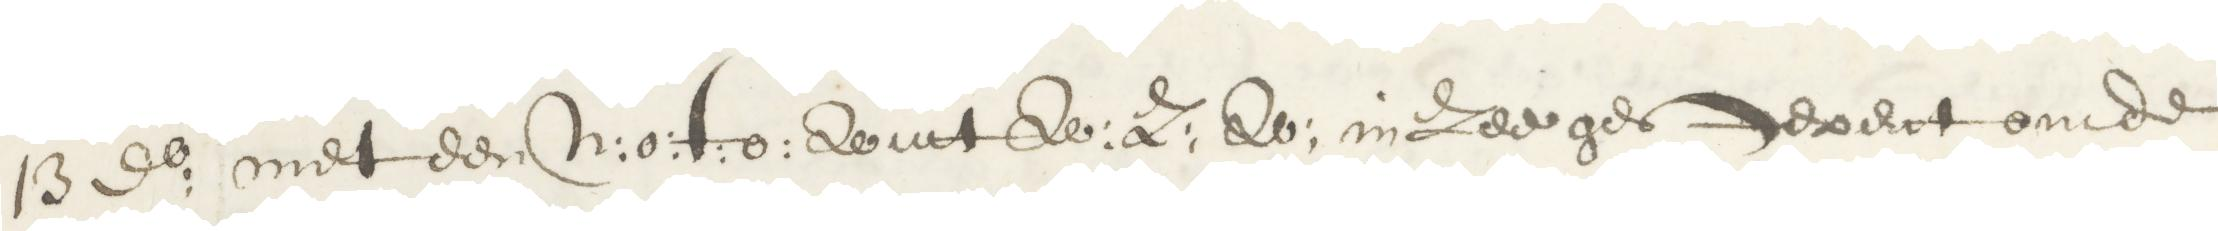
13 d:o met een n:o:t:o: Wint W: Z: W: in Zee gestevent om de
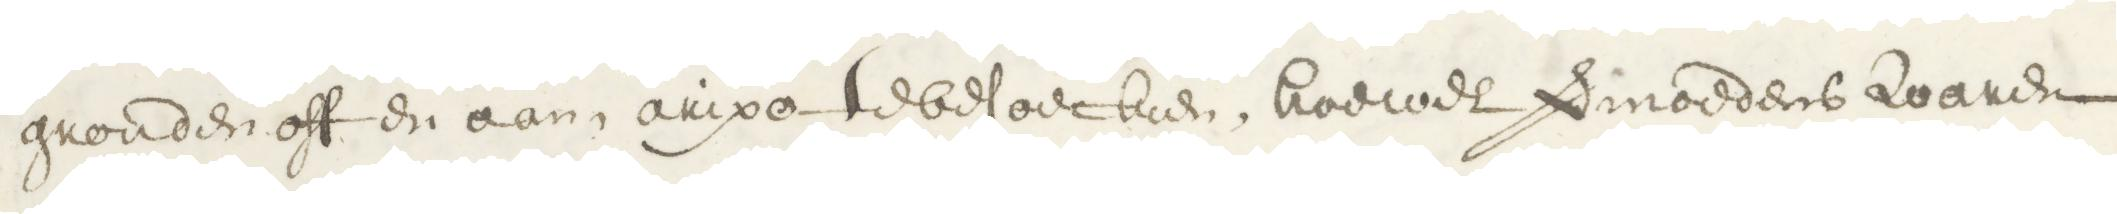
gronden off en aan, aripo te besoecken, hoewel Vermoedens Waren
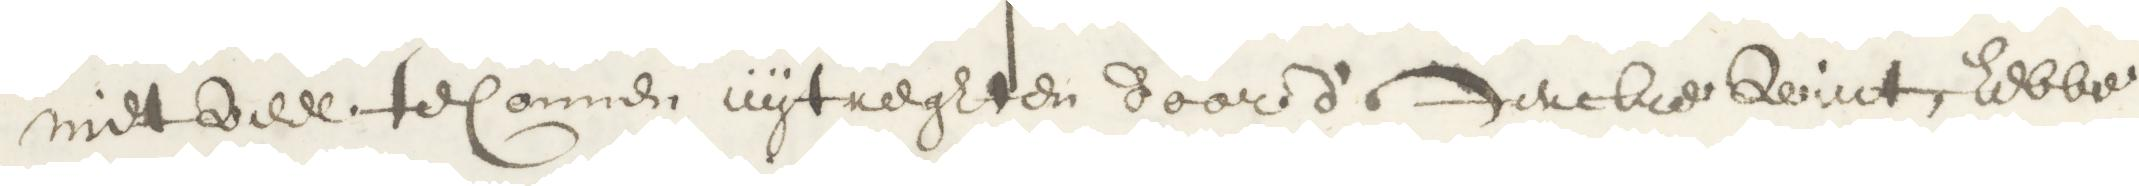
niet veel te connen uijtreghten door d’ stercke Wint, hebbe
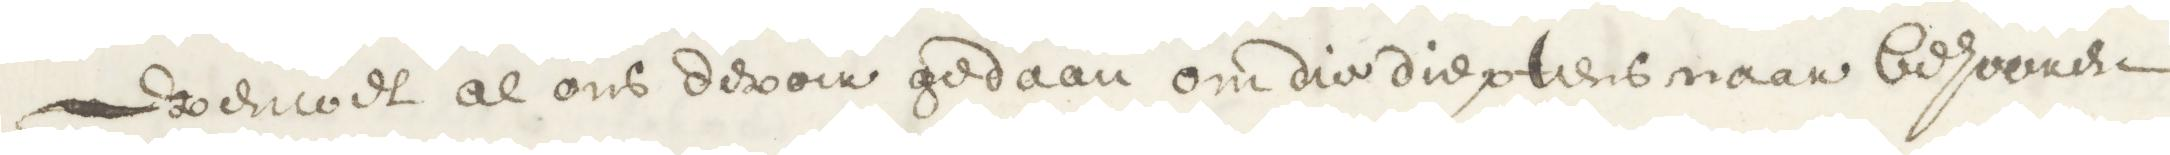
Evenwel al ons devoir gedaan om die dieptens naar behooren
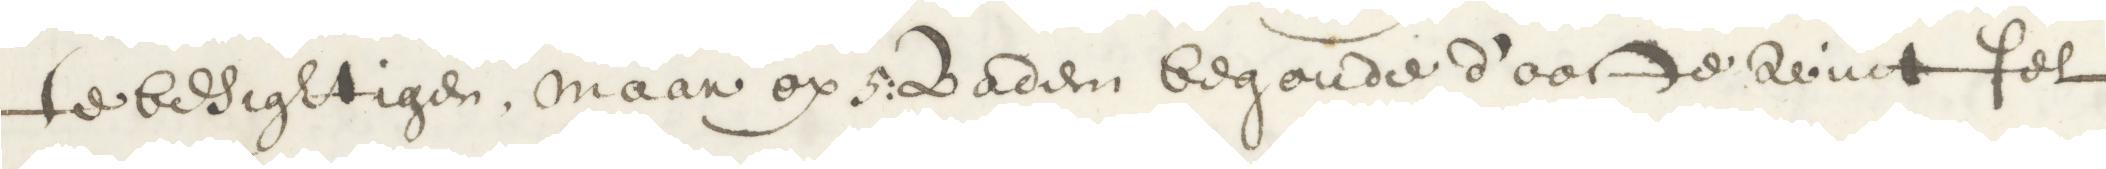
te besightigen, maar op 5: Vadem begon de d’ooste Wint fel
